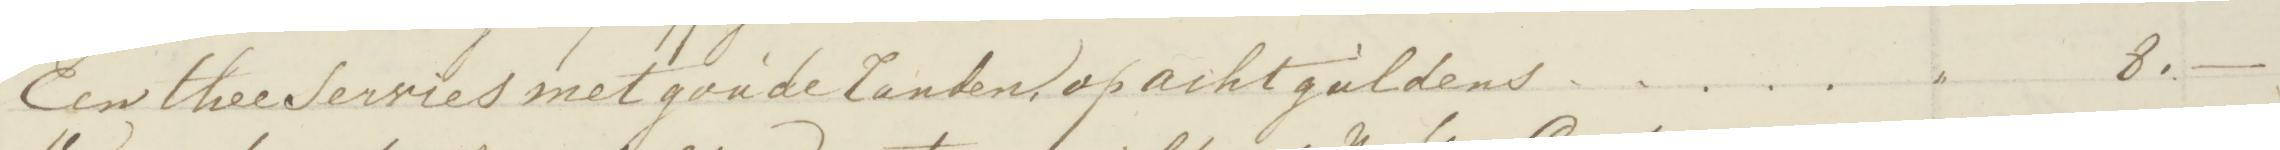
Een theeservies met goude randen, op acht guldens - - - - - „ 8„—
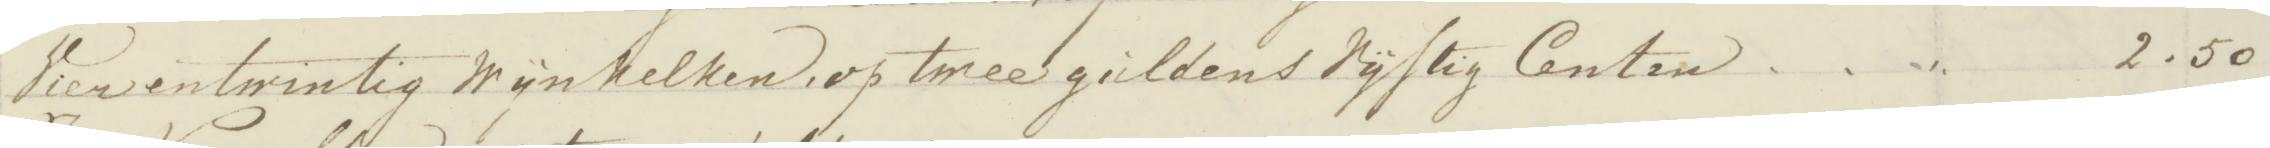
Vier entwintig wijnkelken, op twee guldens Vijftig Centen - - „ 2„50
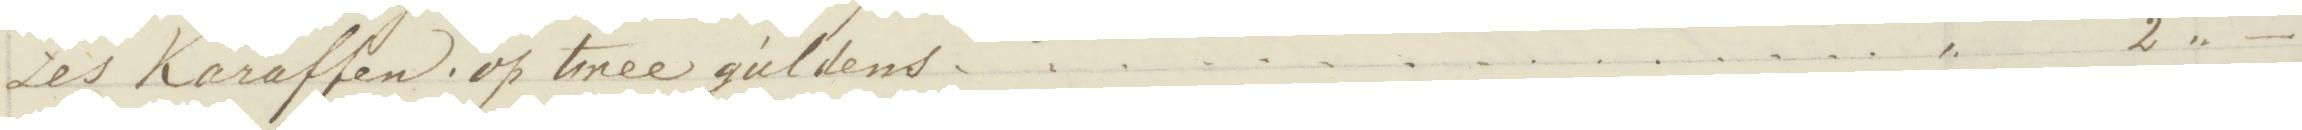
Zes Karaffen, op twee guldens - - - - - - - - - - - - - - - „ 2 „ —
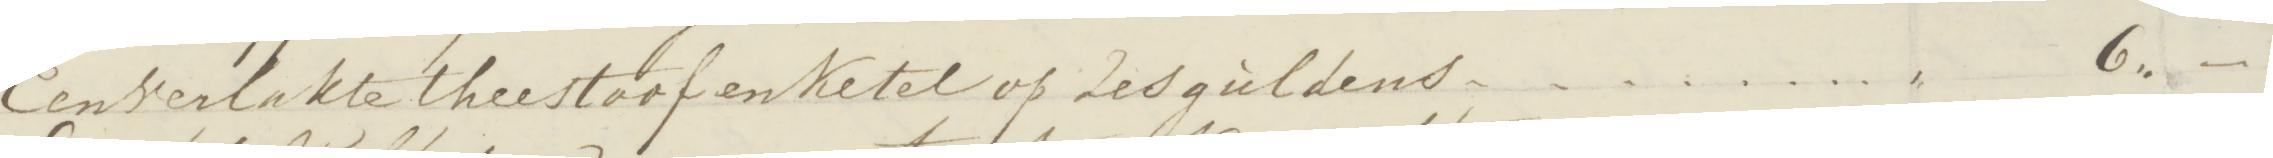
Een verlakte theestoof en ketel op zes guldens - - - - - - - - „ 6„ —
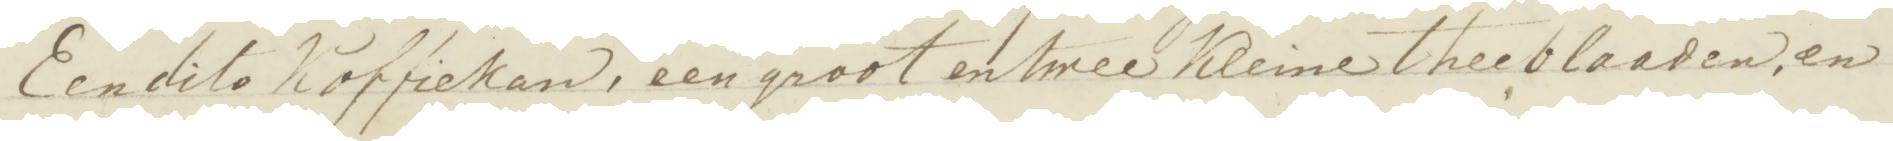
Een dito Koffiekan, een groot en twee kleine theeblaaden, en
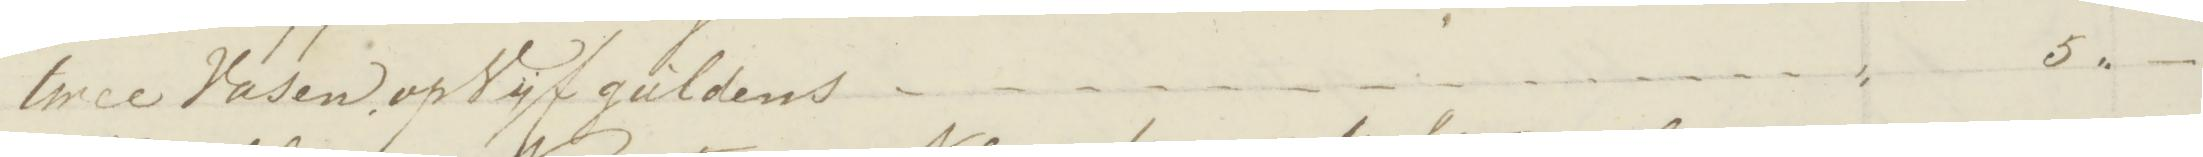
twee Vasen, op Vijf guldens - - - - - - - - - - - - - - „ 5 „ —
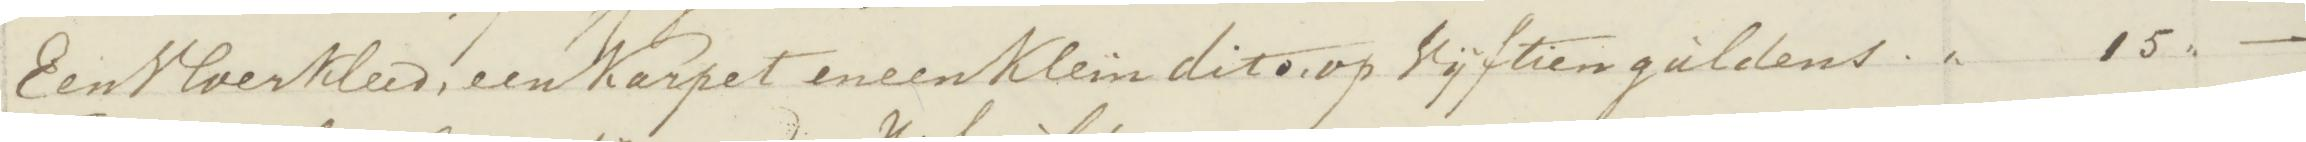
Een Vloerkleed, een Karpet en een klein dito, op vijftien guldens - „ 15„ —
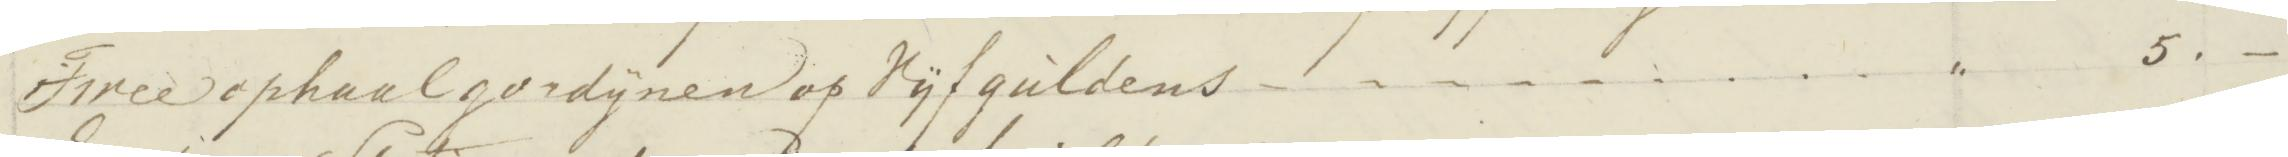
Twee ophaalgordijnen op Vijf guldens - - - - - - - - - „ 5 . —
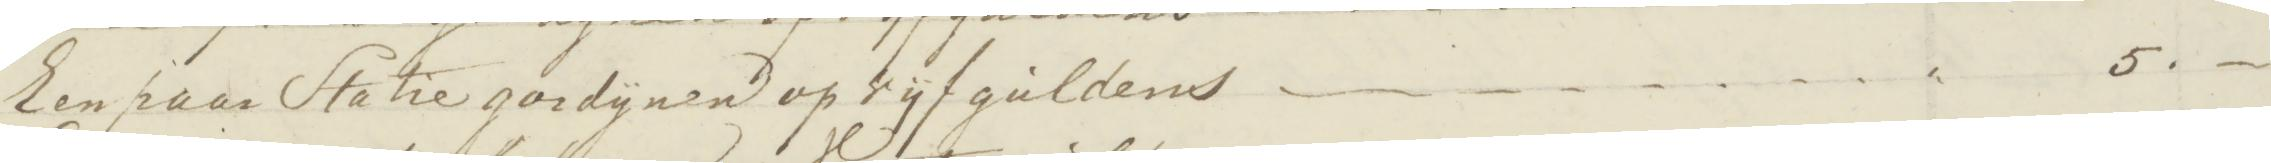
Een paar Statie gordijnen op vijf guldens - - - - - - - - „ 5 . —
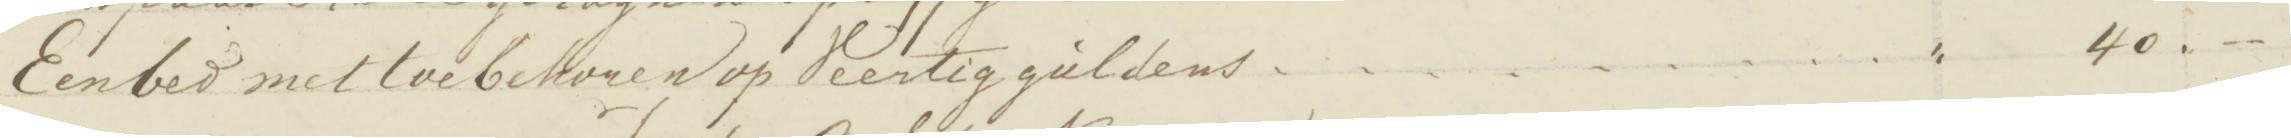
Een bed met toebehoren op Veertig guldens - - - - - - - - - „ 40 „ —
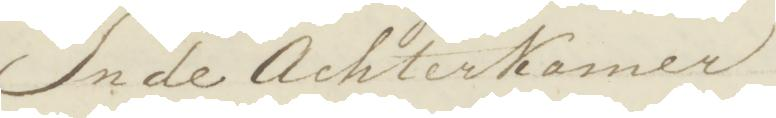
In de Achterkamer
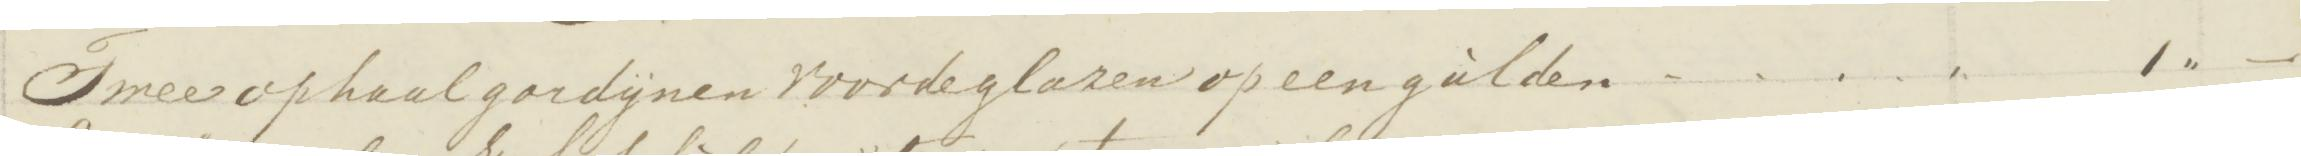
Twee ophaalgordijnen voordeglazen op een gulden - - - - „ 1„ —
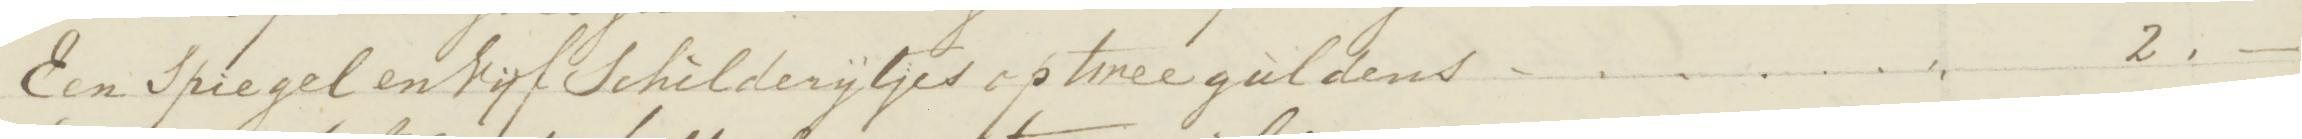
Een spiegel en vijf schilderijtjes op twee guldens - - - - - - „ 2„ —
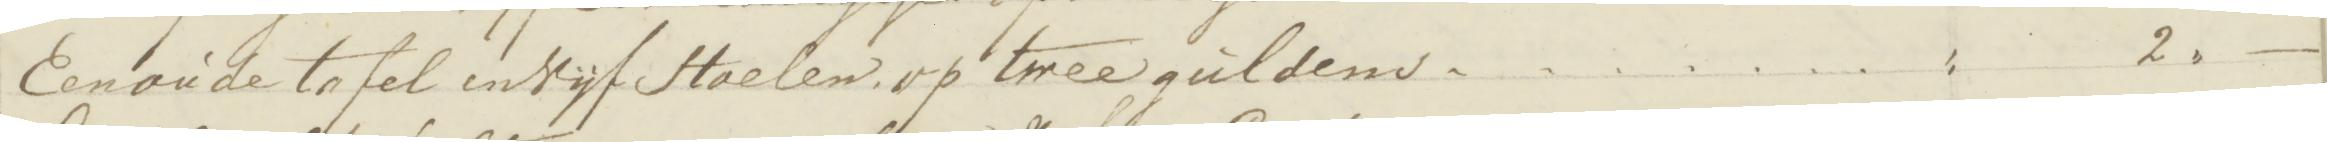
Een oude tafel en vijf stoelen, op twee guldens -- - - - - - „ 2„ —
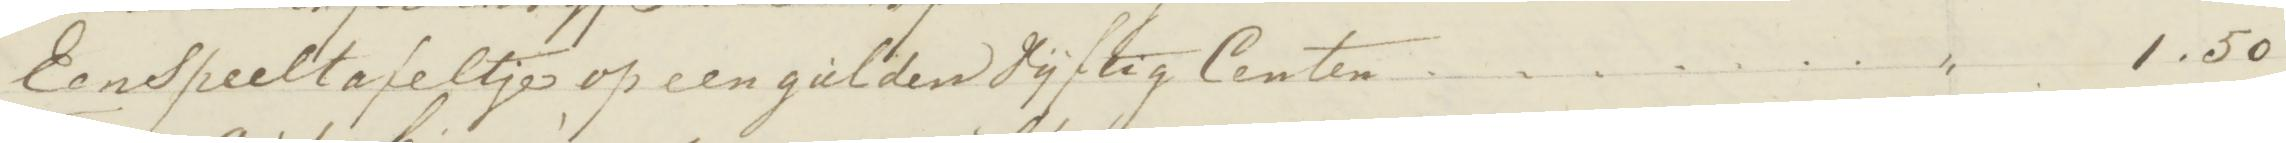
Een speeltafeltje op een gulden Vijftig Centen - - - - - - - „ 1.50
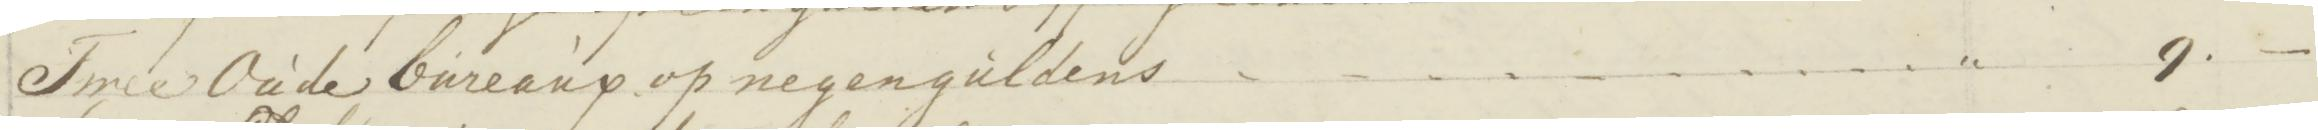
Twee Oude bureaux op negen guldens - - - - - - - - - - „ 9. —
